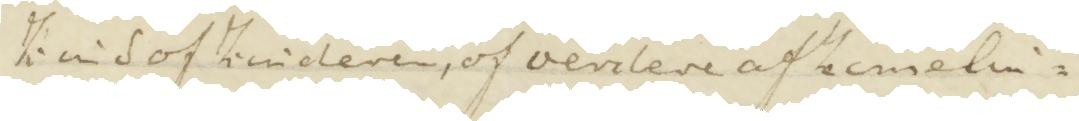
kind of kinderen, of verdere afkomelin=
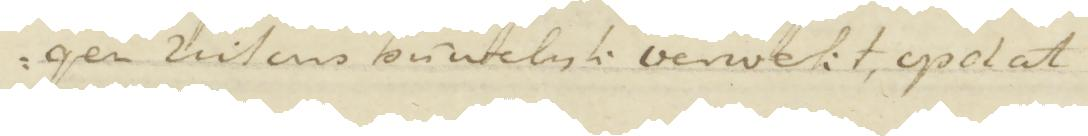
=gen uit ons huwelijk verwekt, opdat
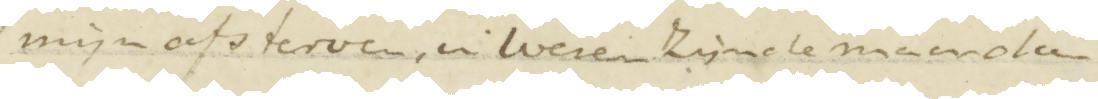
mijn afsterven, in wezen zijnde maar die
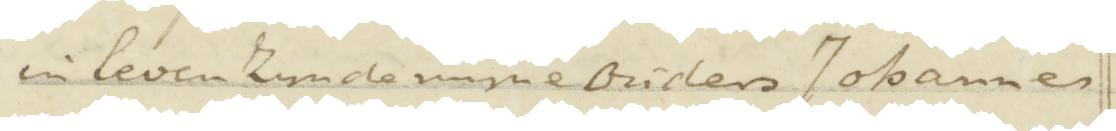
in leven Zynde myne ouders Johannes
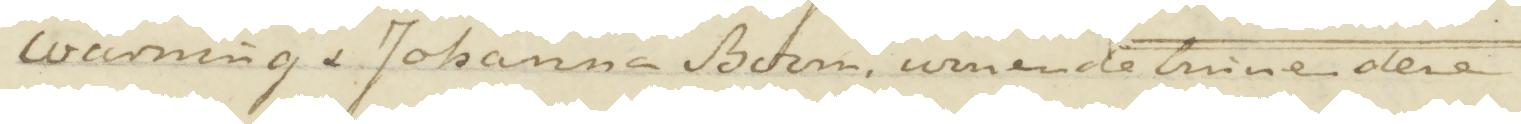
warning & Johanna Boom, wonende binnen deze
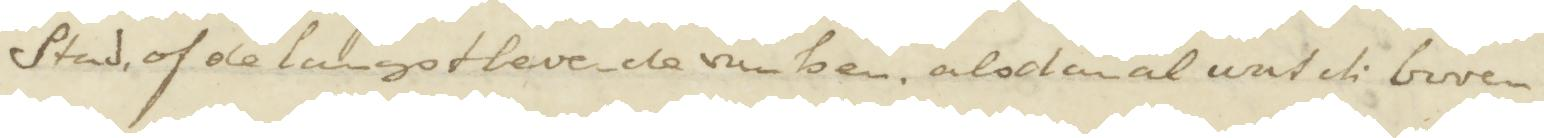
Stad, of de langstlevende van hen, als dan al wat ik boven
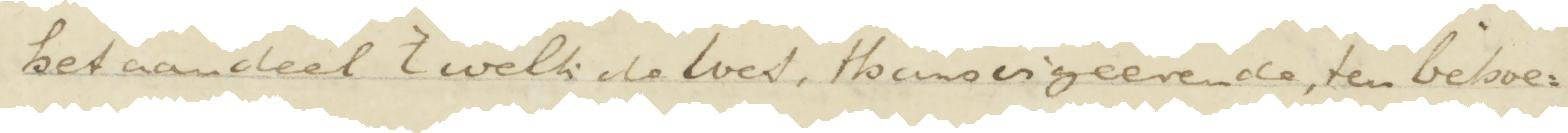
het aandeel t welk de wet thans vigeerende, ten behoe=
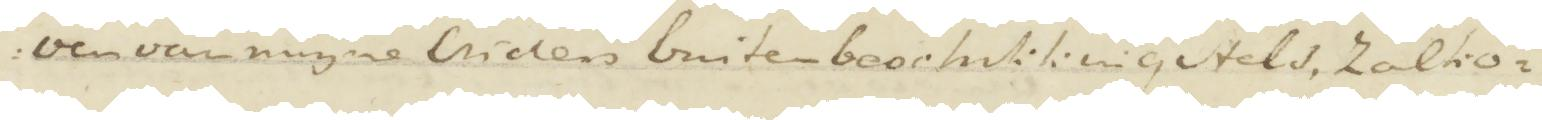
:ven van mijne Ouders buiten beschikking steld, zal ko=
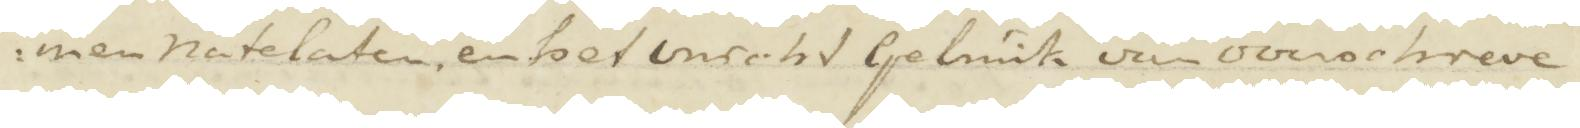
:men natelaten, en het vrucht Gebruik van voorschreve
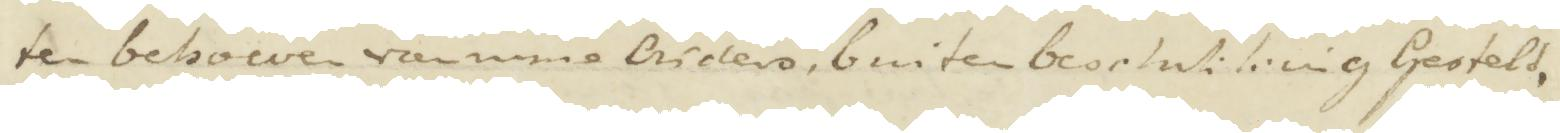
ten behoeven van myne Ouders, buiten beschikking Gesteld,
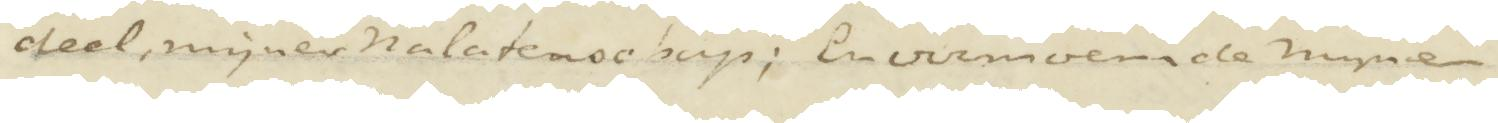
deel, mijner nalatenschap; En voornoemde mynen
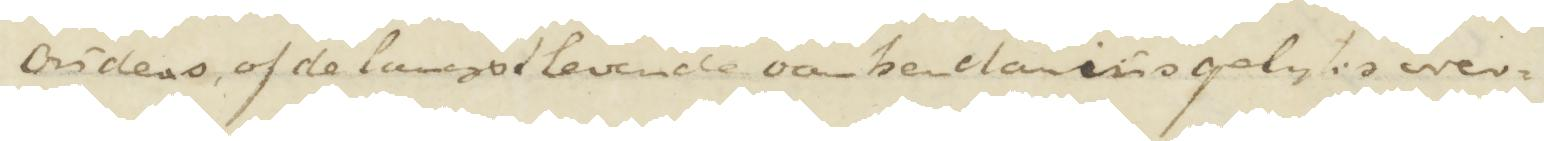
Ouders, of de langstlevende van hen dan insgelyks over=
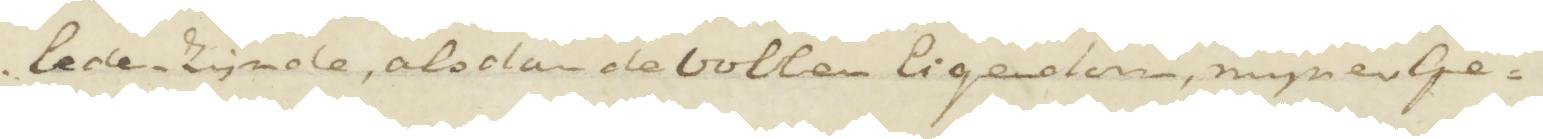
„leden zijnde, als dan de vollen Eigendom, myner ge=
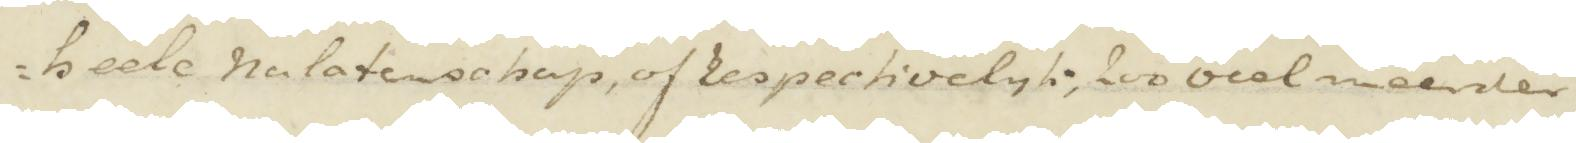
=heele nalatenschap, of respectivelyk, zoo veel meerder
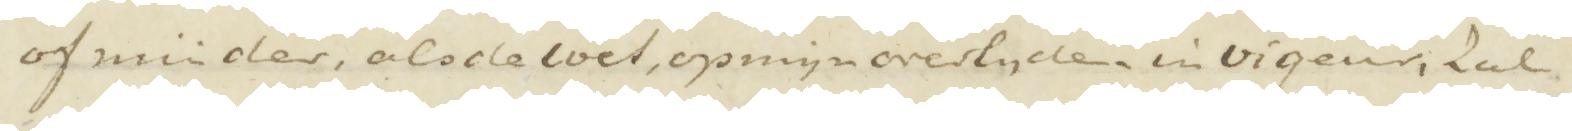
of minder, als de wet, op mijn overlyden in vigeur, zal
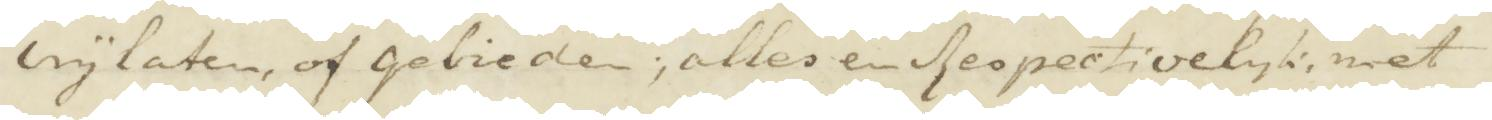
vrijlaten, of gebieden; alles en Respectivelyk, met
